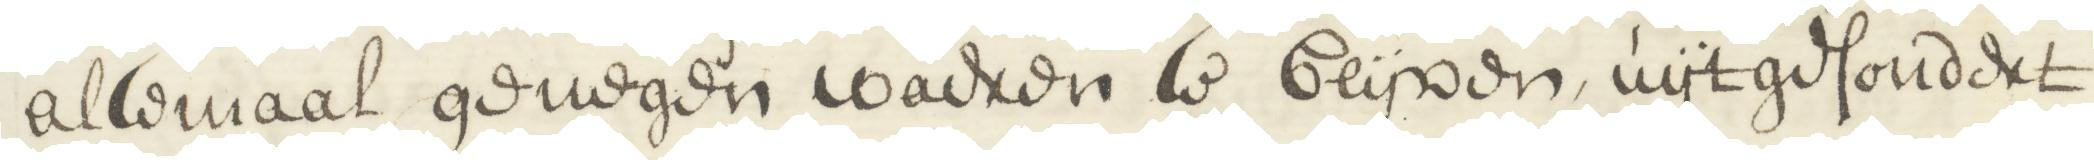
altemaal genegen waeren te blijven, uijtgesondert
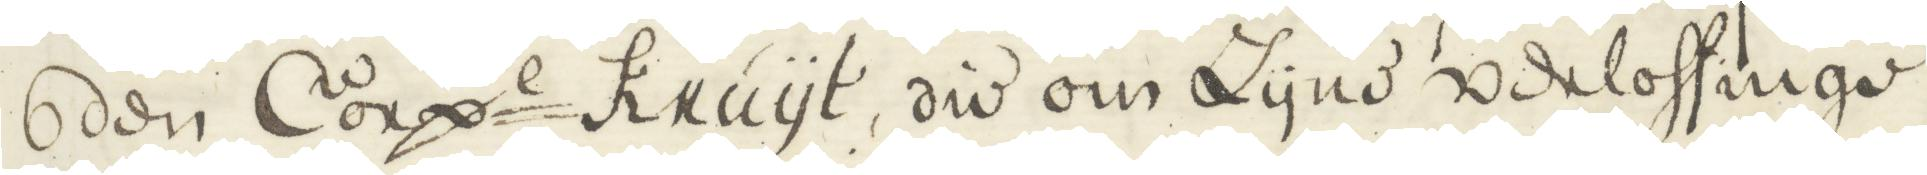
den Corp=l kruijt, die om zijne verlossinge
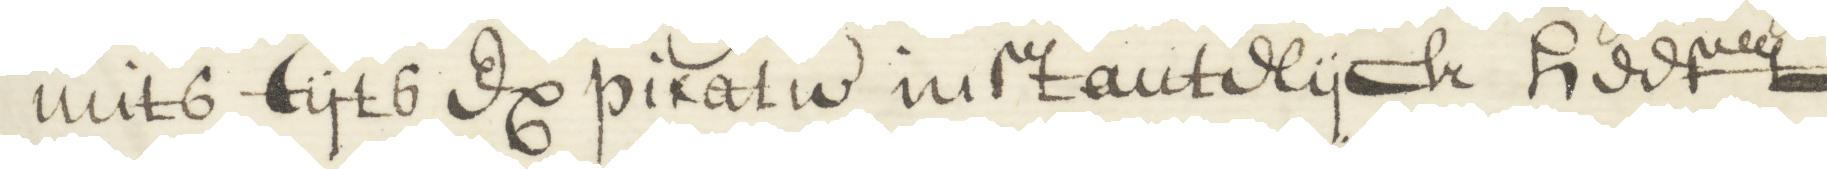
mits tijts Expiratie instantelijck heeft
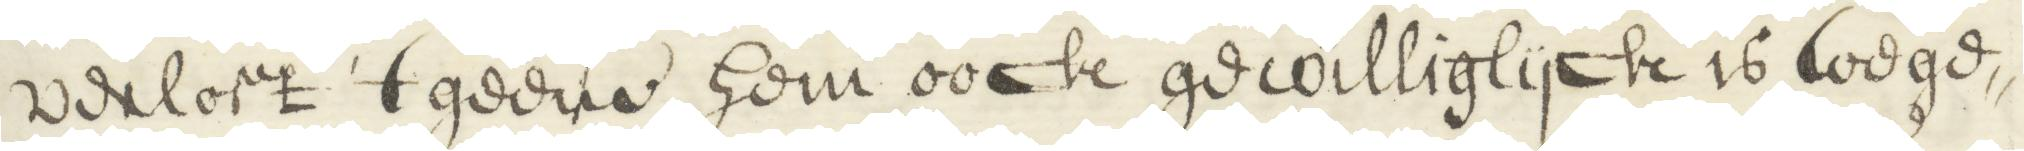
verlost ’t geene hem oock gewilliglijck is toege„
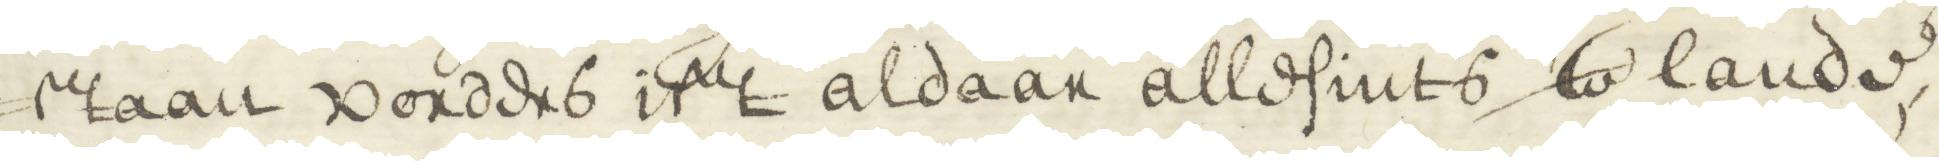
„staan vorders ist aldaar allesints te lande,
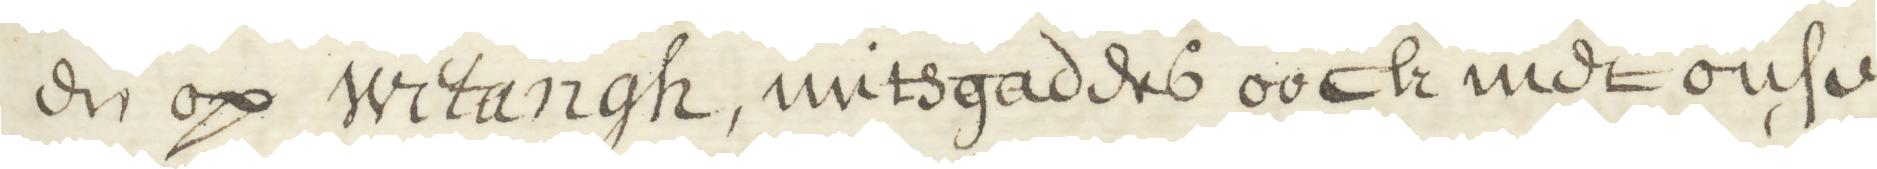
en op witangh, mitsgaders oock met onse
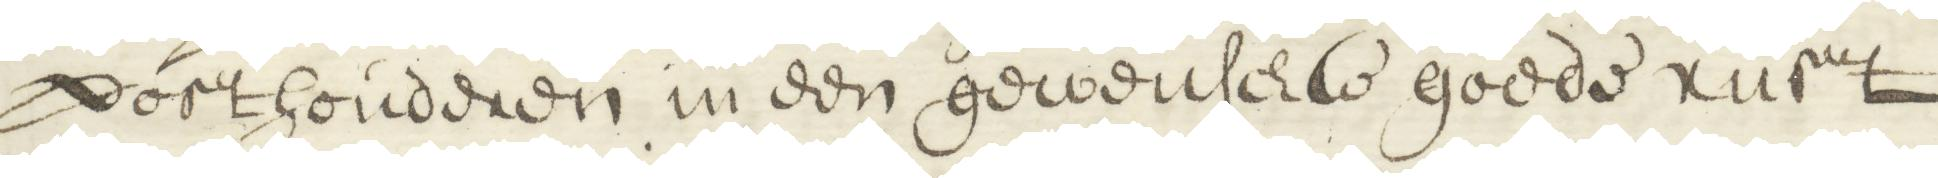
posthouderen in een gewenschte goede rust
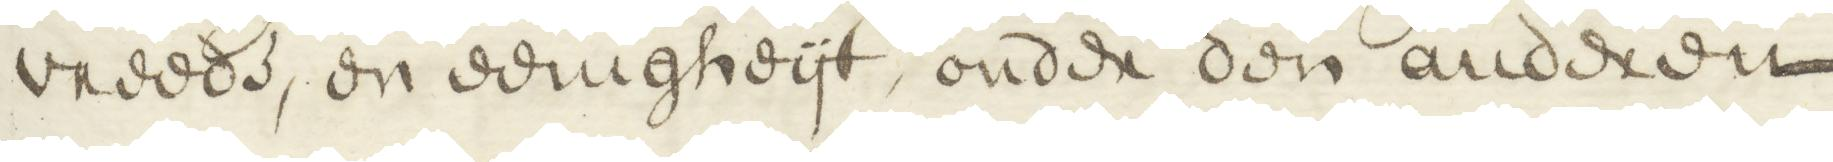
vreede, en eenigheijt, onder den anderen
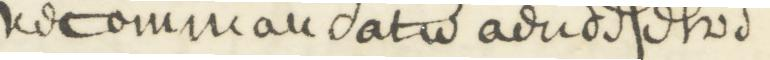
recommandatie aen deselve
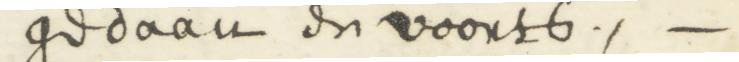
gedaan en voorts. / —
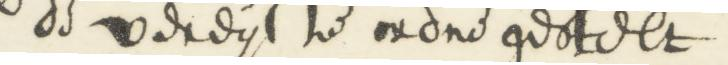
de vereijste ordre gestelt
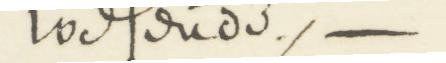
wesende. / —
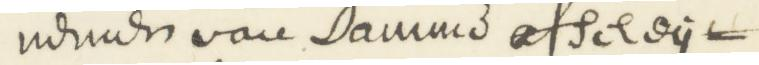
nemen van Damme afscheijt
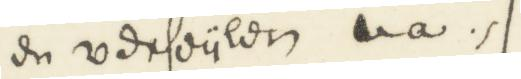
en verseijlen na. /
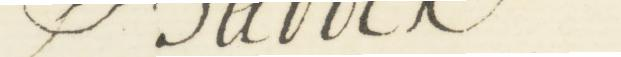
Babbir
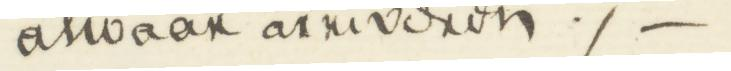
alwaar arriveren. / —
